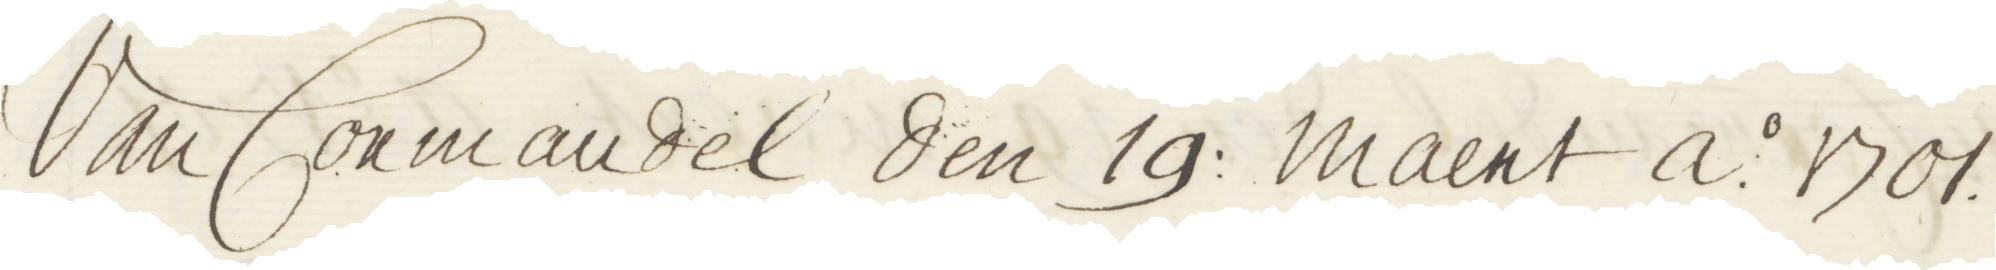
Van Cormandel den 19: Maert a:o 1701.
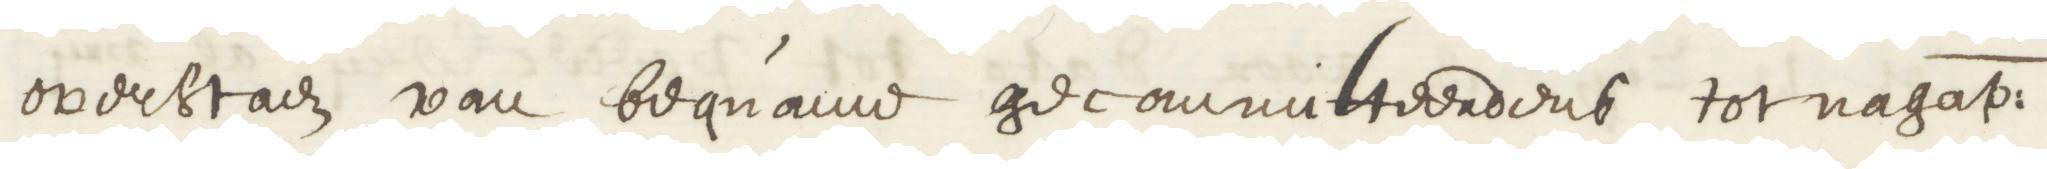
overstaen van bequame gecommitteerdens tot nagap:
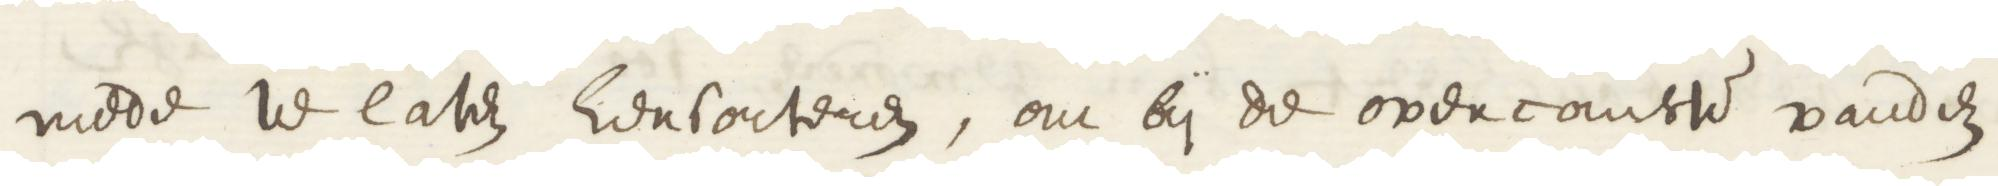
mede te laten hersorteren, om bij de overcomste vanden
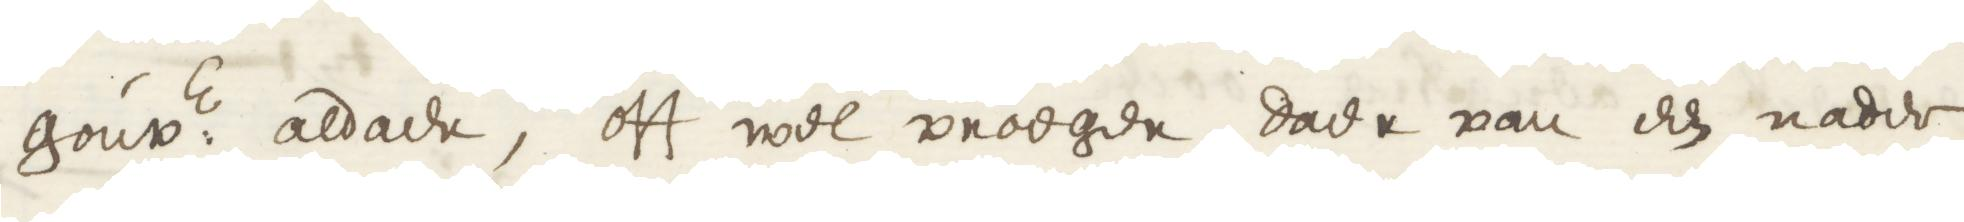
gouv:r aldaer, off wel vroeger, daer van een nader
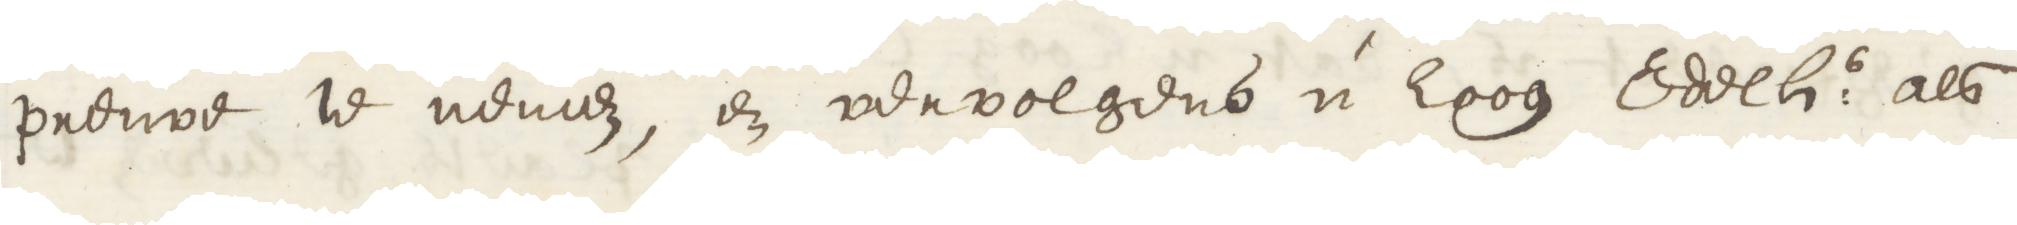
preuve te nemen, en vervolgens u hoog Edelh:s als
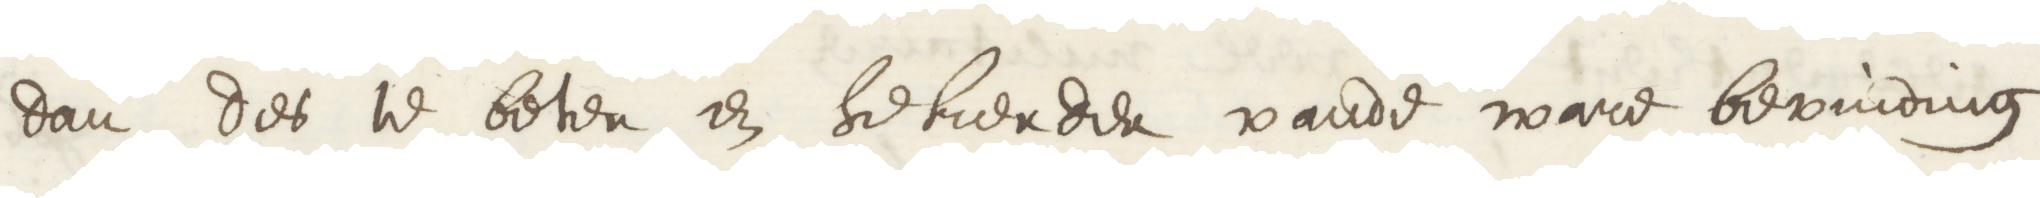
dan des te beter en sekerder vande ware bevinding
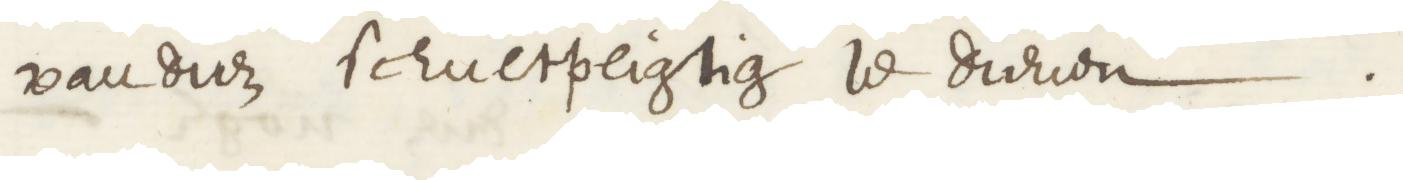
van dien schultpligtig te dienen.
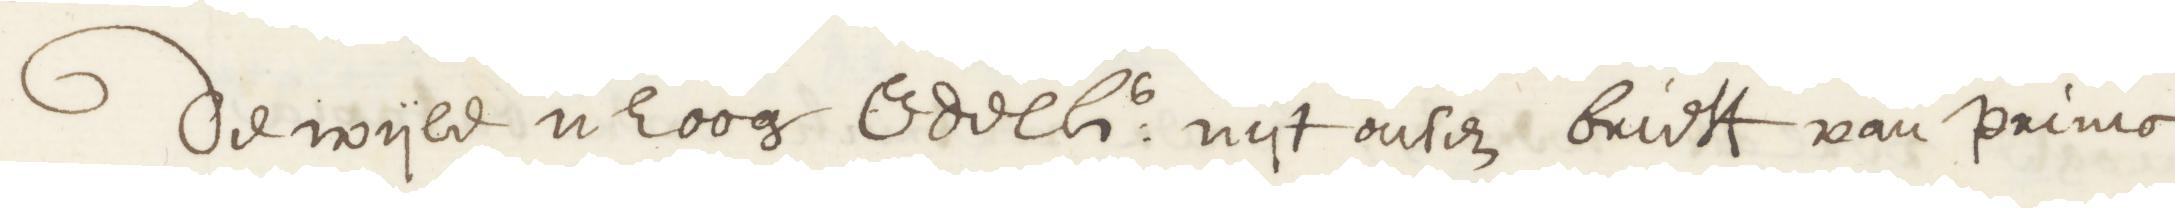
de wijle u hoog Edelh:s uijt onsen brieff van primo
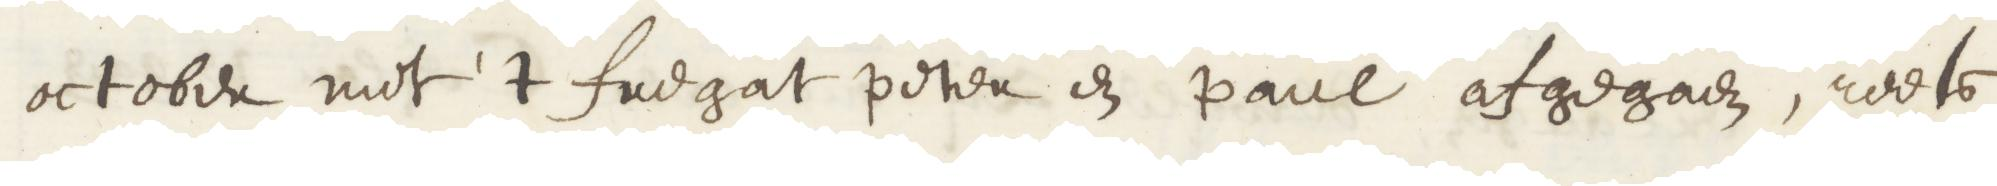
october met ’t fregat peter en paul afgegaen, reets
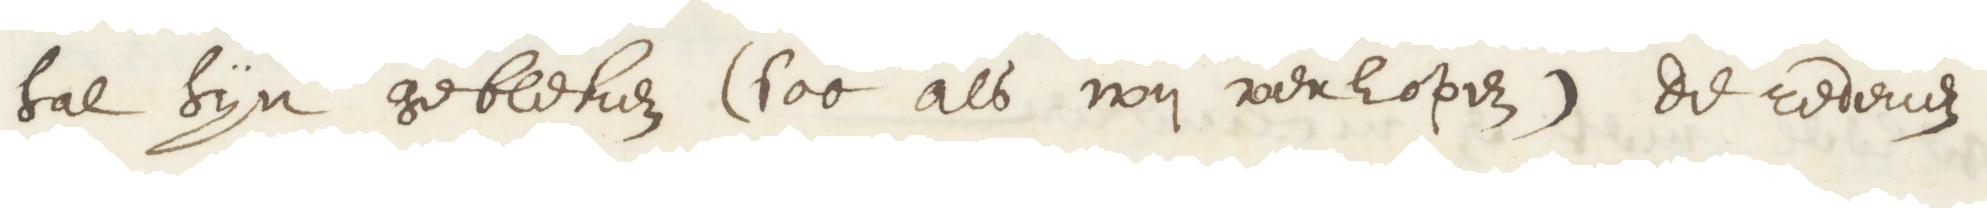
sal sijn gebleken (soo als wij verhopen) de redenen
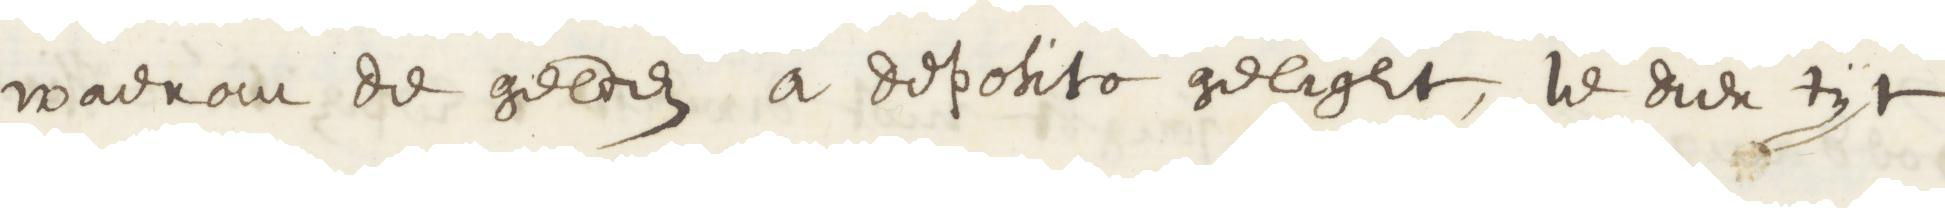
waerom de gelden â deposito gelight, te dier tijt
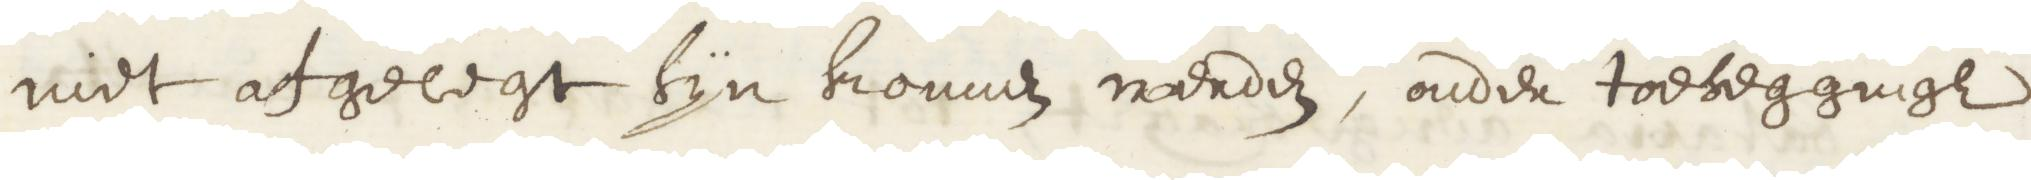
niet afgelegt sijn konnen werden, onder toeseggingh
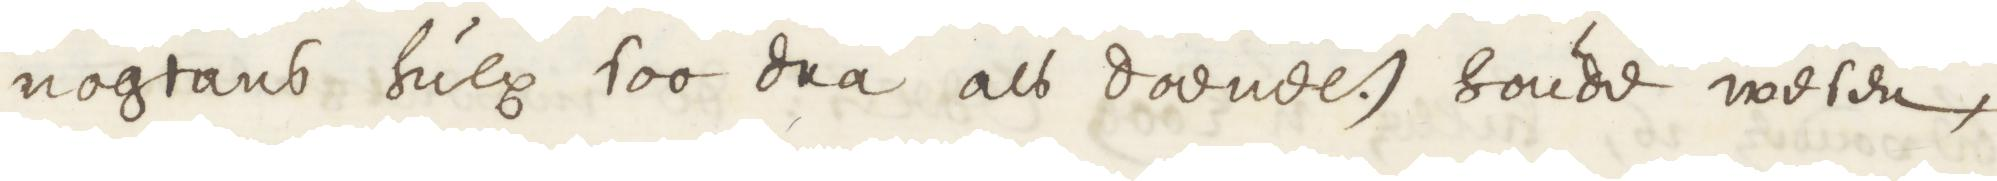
nogtans sulx soo dra als doenelijk soude wesen,
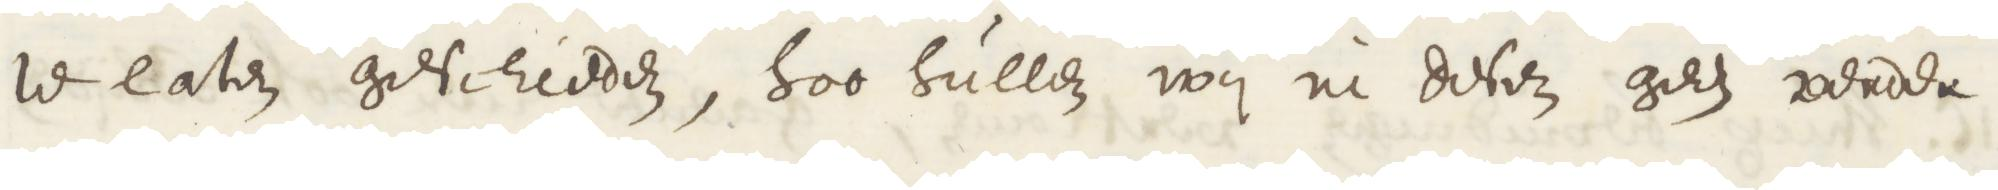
te laten geschieden, soo sullen wij in desen geen verder
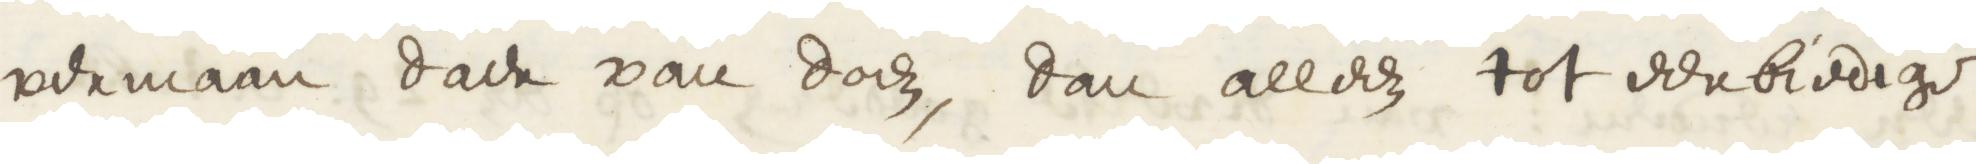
vermaan daer van doen, dan alleen tot eerbiedige
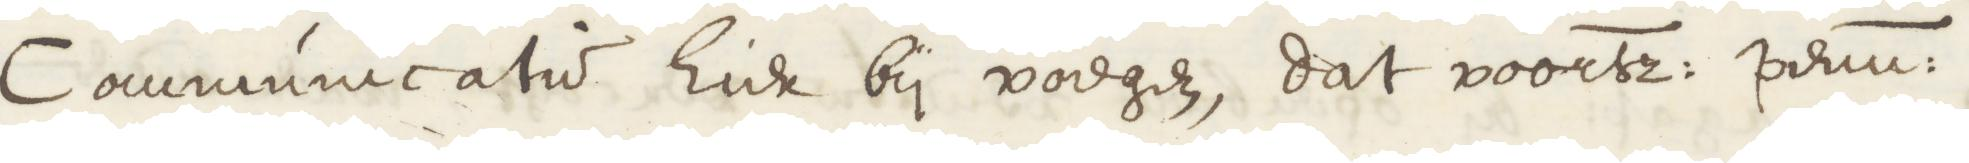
Communicatie hier bij voegen, dat voorsz: penn:
